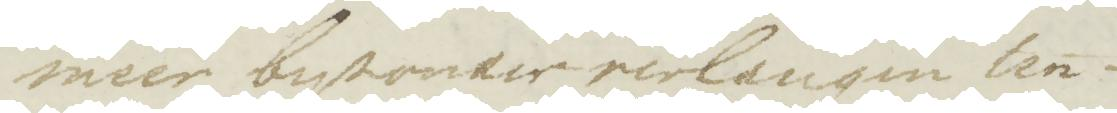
meer byzonder verlangen ten
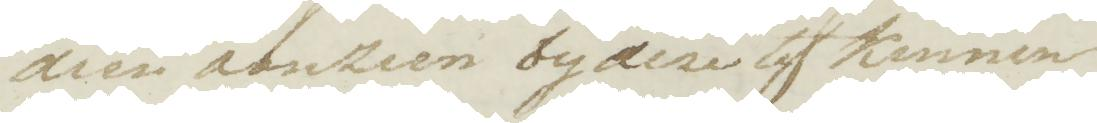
dien aanzien bij deze te kennen
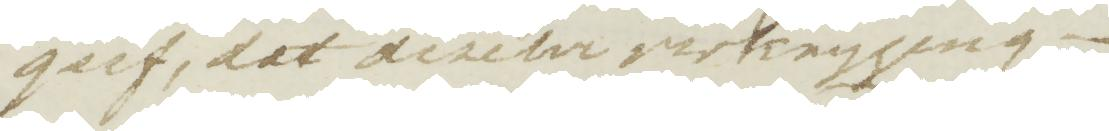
geef, dat dezelve verkryging
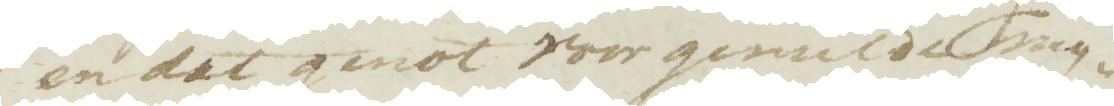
en dat genot voor gemelde my„
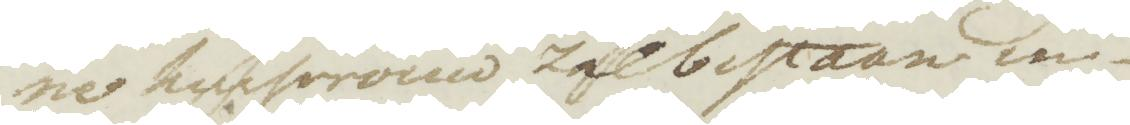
ne huisvrouw zal bestaan in
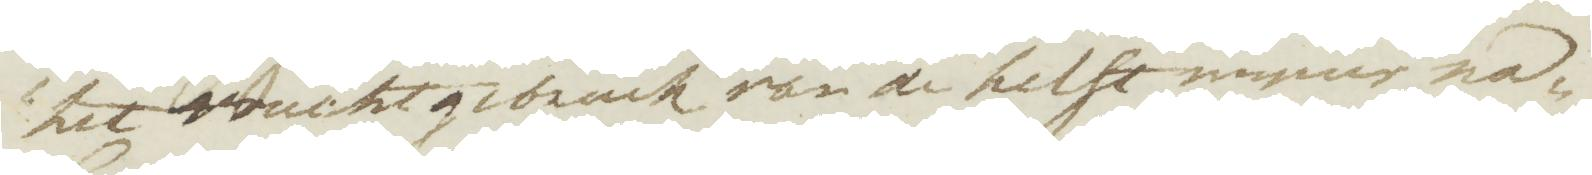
het vruchtgebruik van de helft myner na„
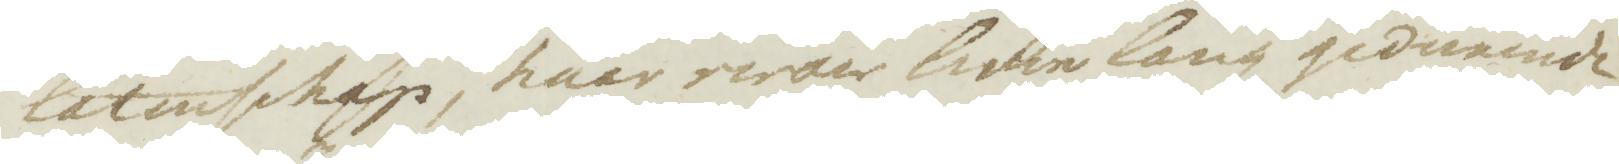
latenschap, haar verder leven lang gedurende
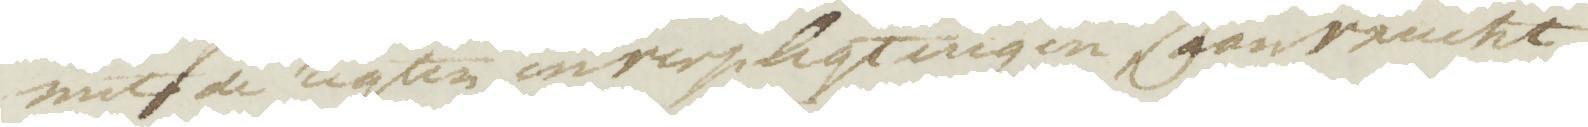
met de regten en verpligtingen, aan vrucht
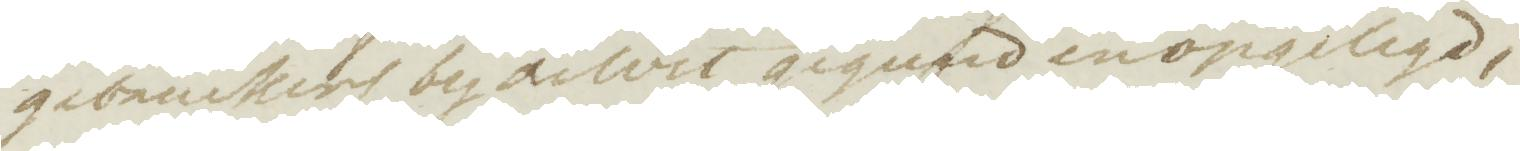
gebruikers by de wet gegund en opgelegd,
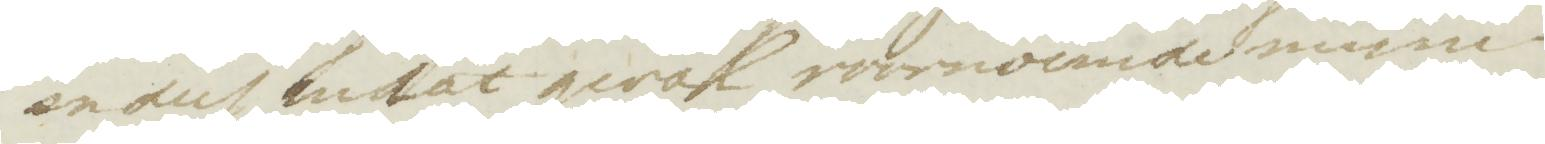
en dus indat geval voornoemde myne
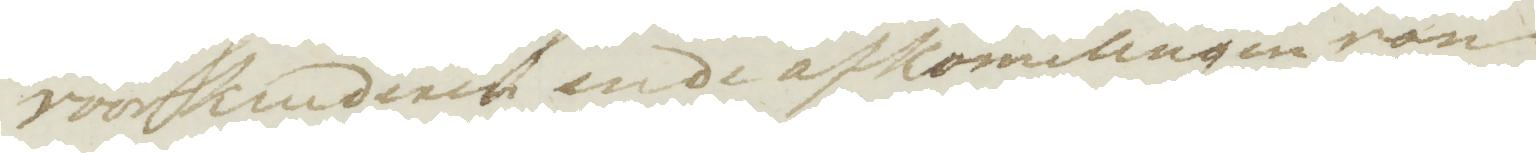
voorkinderen en de afkomelingen van
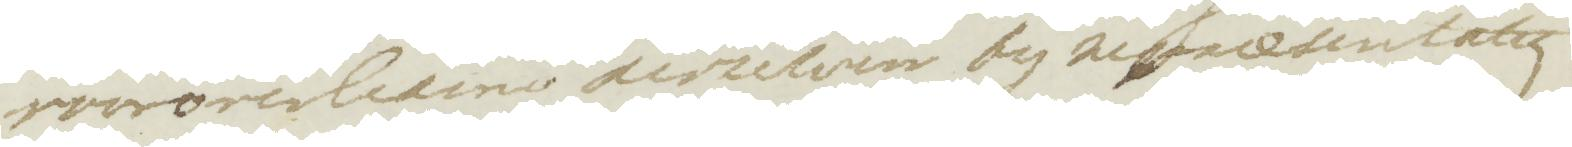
vooroverledene derzelven by representatie
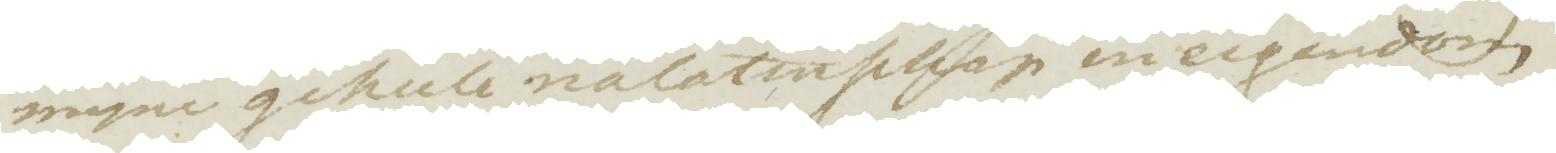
myne geheele nalatenschap en eigendom
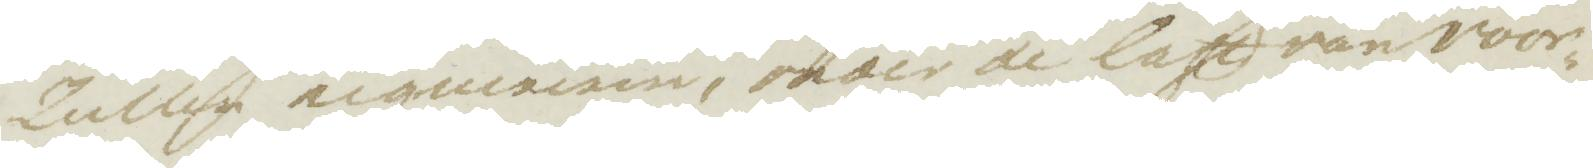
zullen acquireren, onder de last van voor„
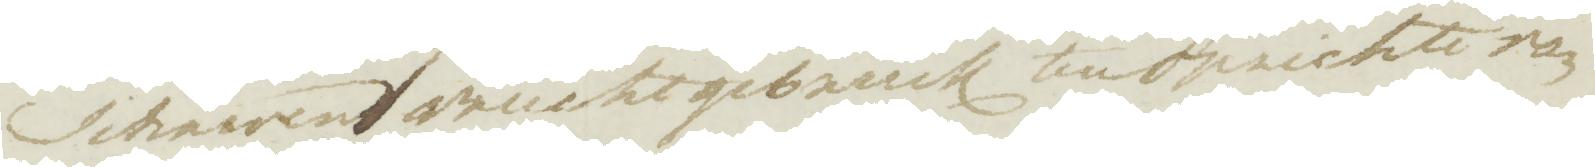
schreven vruchtgebruik ten opzichte van
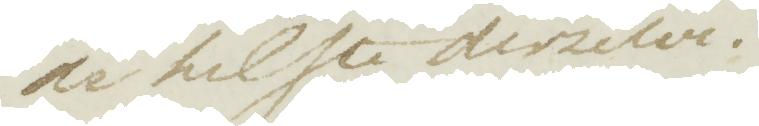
de helfte derzelve.
